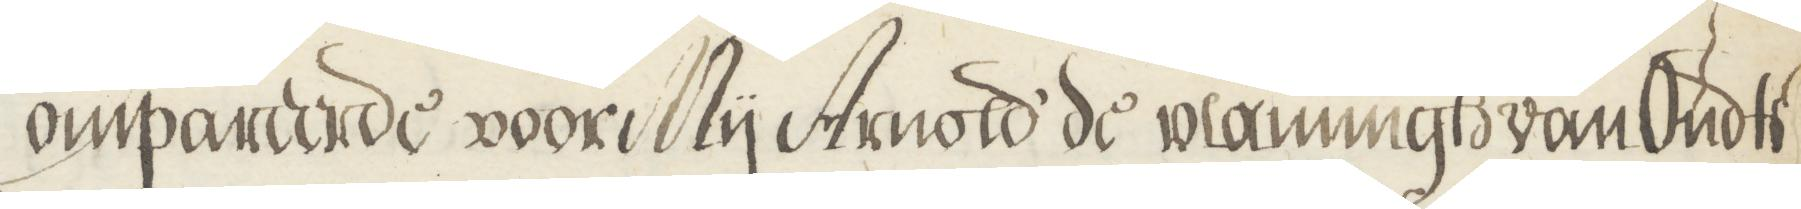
Compareerde voor Mij Arnold de vlamingh van Oudts
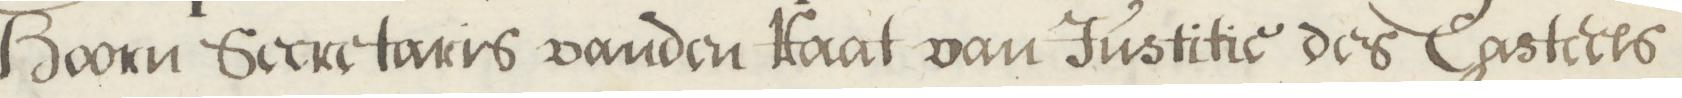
hoorn secretaris van den Raat van Iustitie des Casteels
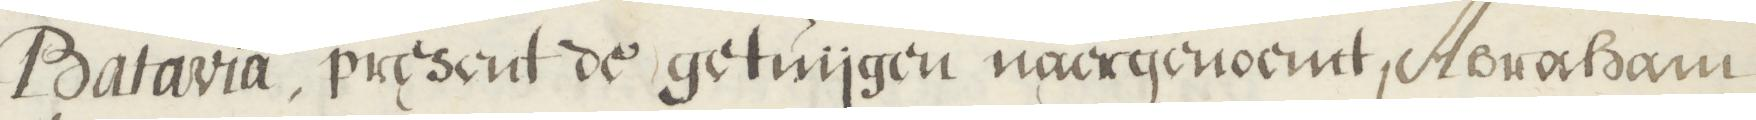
Batavia, present de getuijgen naergenoemt, Abraham
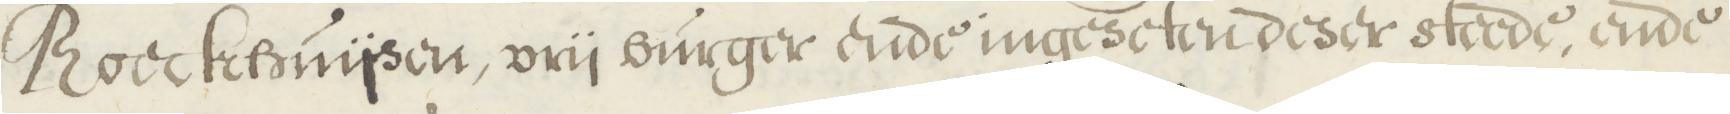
Roeckhuijsen, vrij burger ende ingeseten deser steede, ende
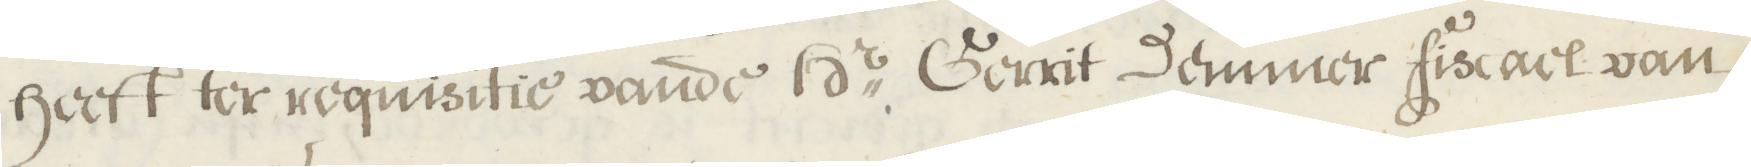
heeft ter requisitie vande h„r Gerrit Demmer fiscael van
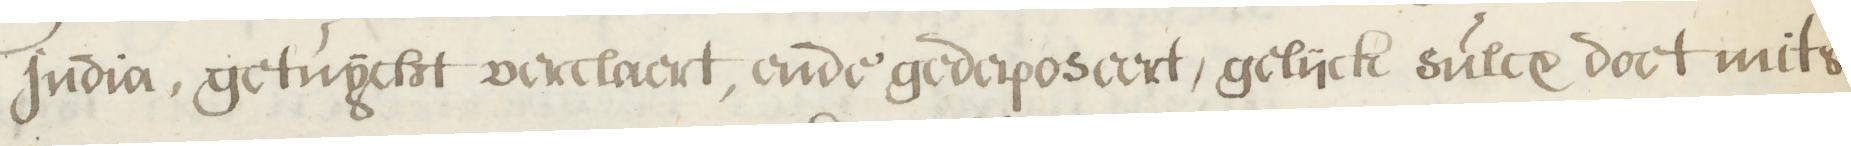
jndia, getuijcht verclaert, ende gedeposeert, gelijck sulcx doet mits
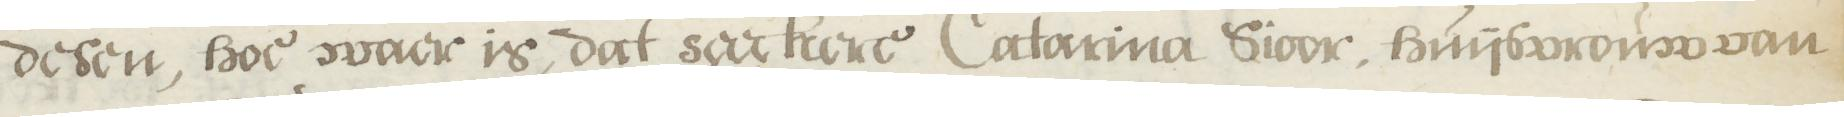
desen, hoe waer is, dat sackere Catarina sioor, huijsvrouw van
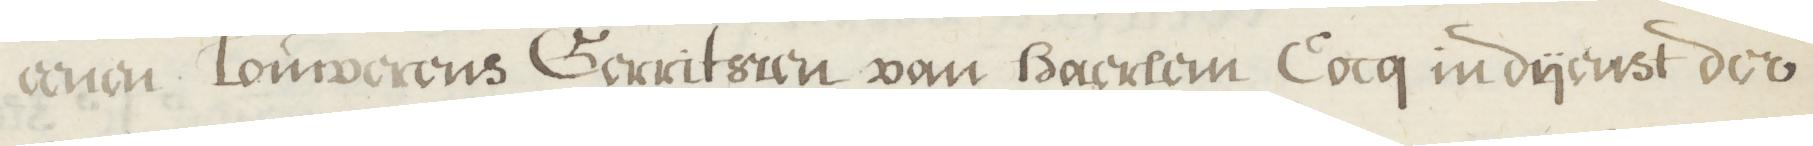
eenen Louwerens Gerritsien van haerlem Cocq in dijenst der
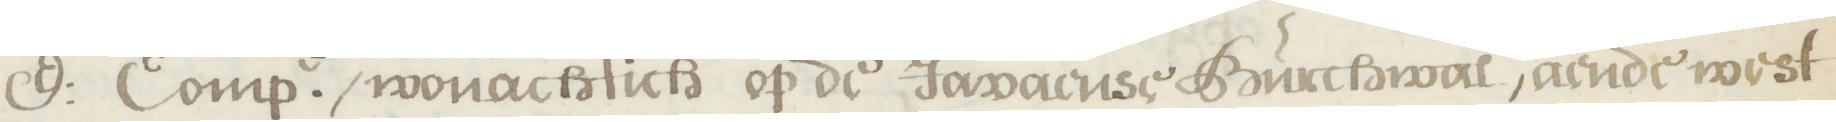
E: Comp.e / wonachtich op de Iavaense Burchwal, aende west
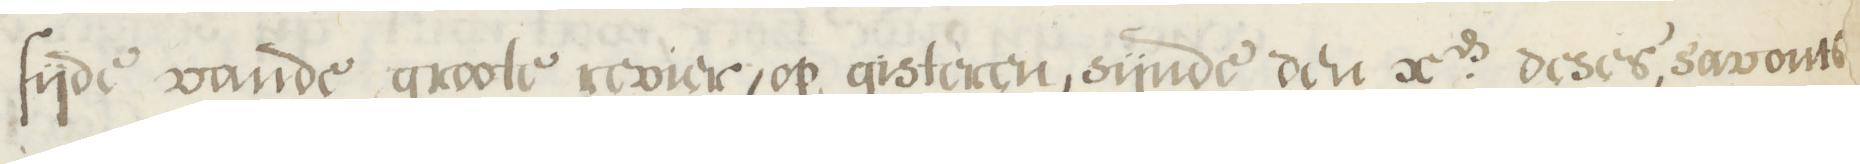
sijde vande groote revier, op gisteren, sijnde den x:en deses, savonts
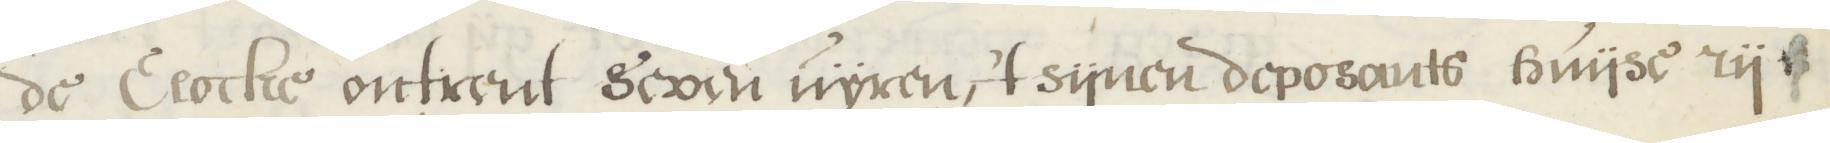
de Clocke ontrent seven uijren, ’t sijnen deposants huijse rijs
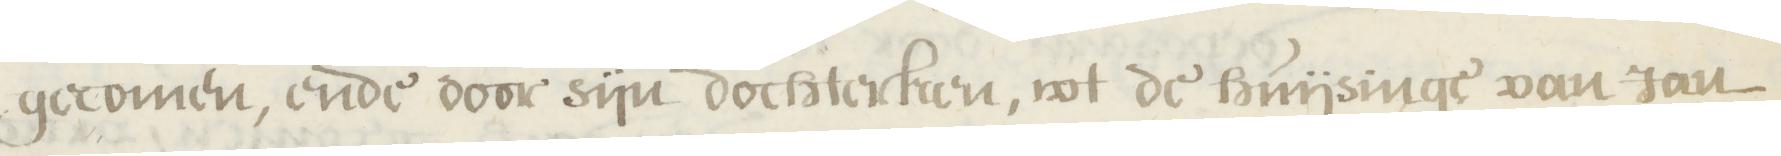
gecomen, ende door sijn dochterken, tot de huijsinge van Ian
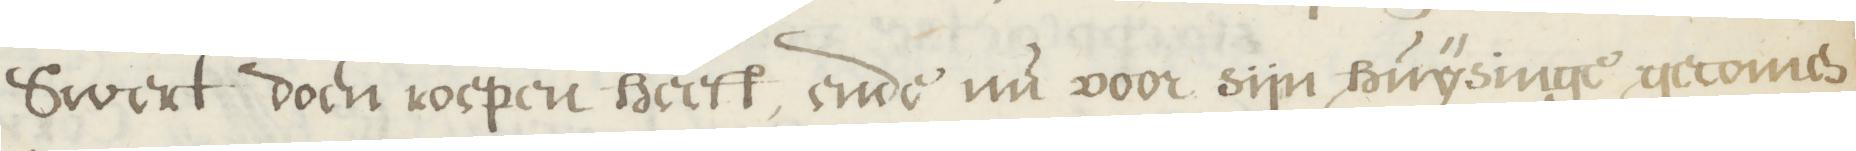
swert doen roepen heeft, ende nu voor sijn huijsinge gecomen
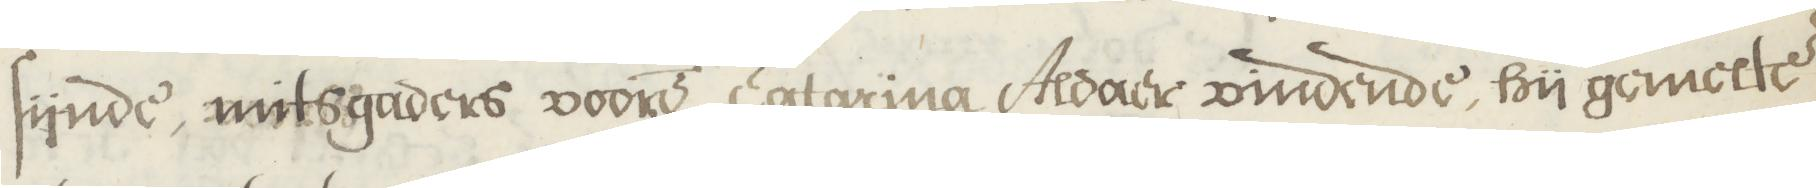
sijnde, mitsgaders voors Catarina Aldaer vindende, hij gemelte
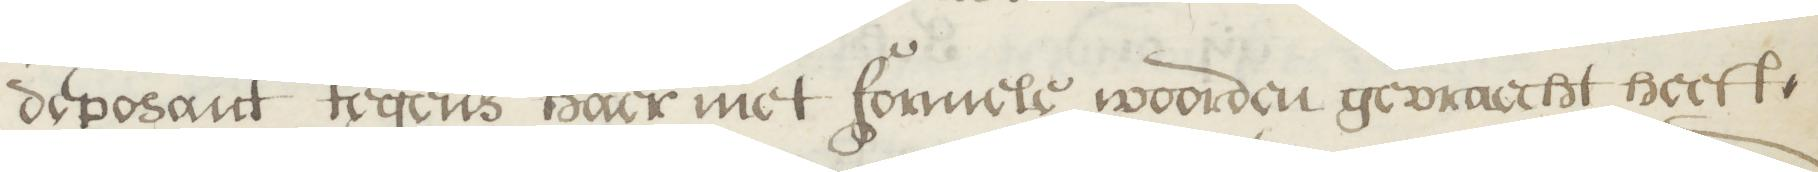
deposant tegens haer met formele woorden gevraecht heeft „
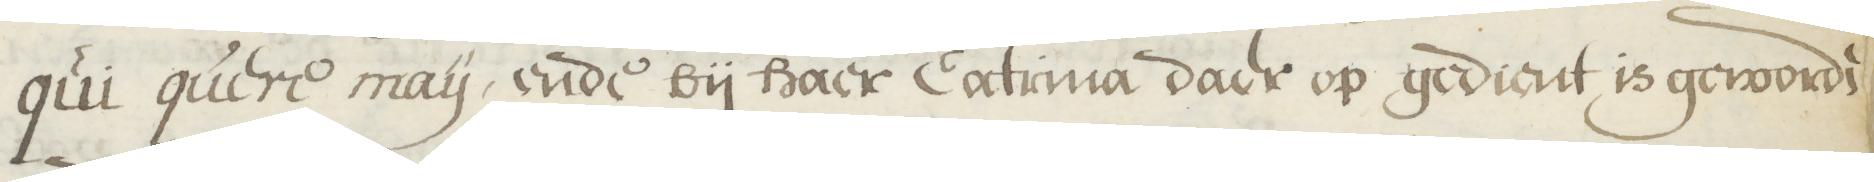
qui quere maij, ende bij haer Catrina daer op gedient is geworde
